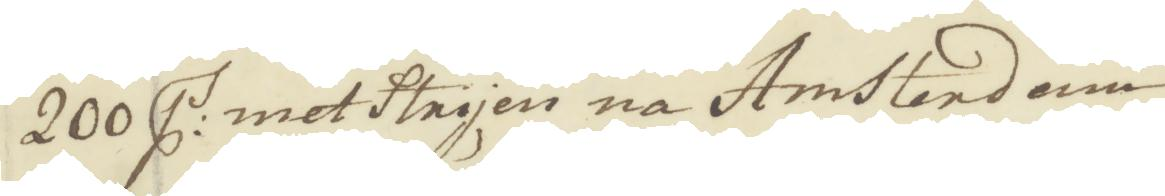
200 p:s met Strijen na Amsterdam
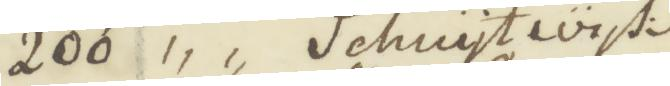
200 „ „ Schuijtwijk
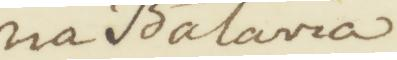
na Batavia
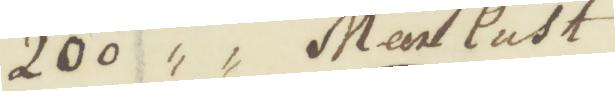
200 „ „ Meer lust
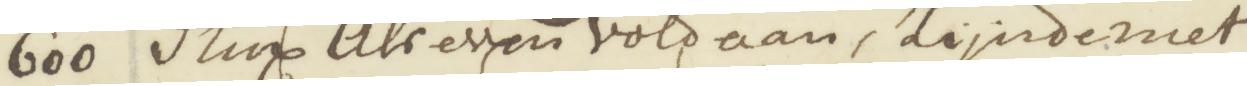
600 stux als even voldaan, zijnde met
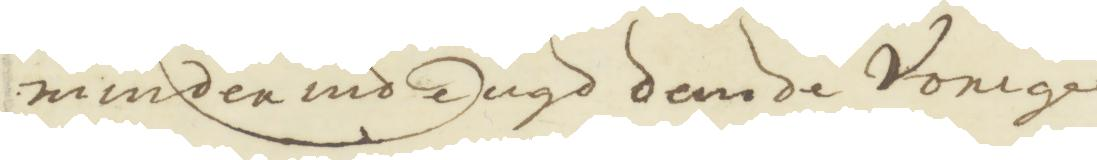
minder indeugd dan de Vorige
